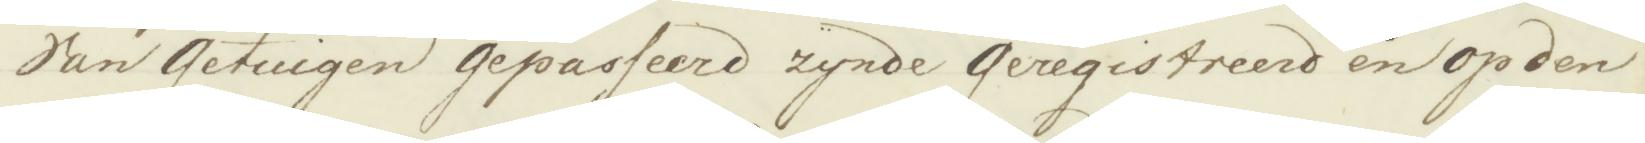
van getuigen gepasseerd zijnde geregistreerd en op den
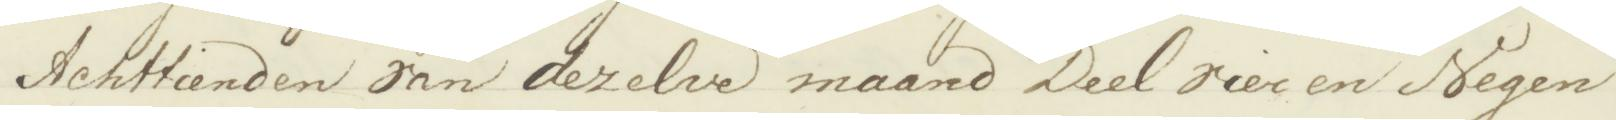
Achttienden van dezelve maand Deel vier en Negen
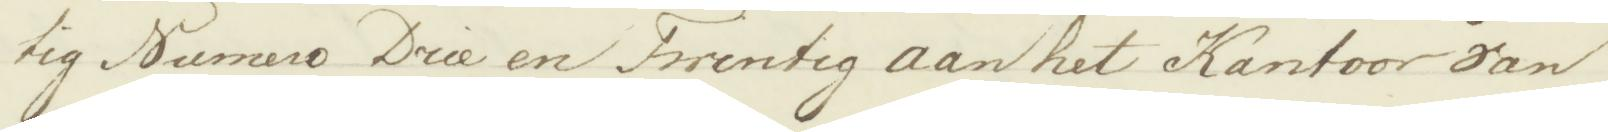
tig Numero Drie en Twintig aan het Kantoor van
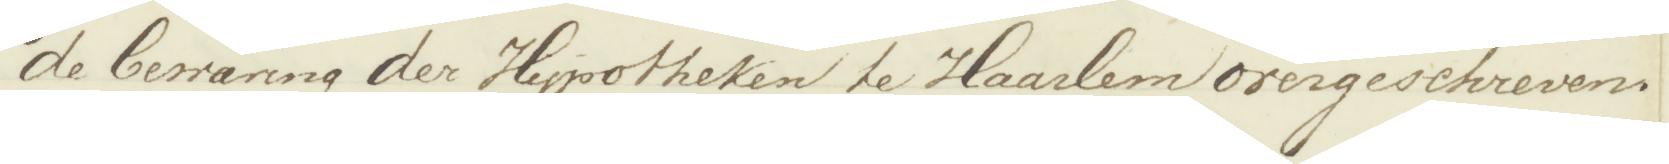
de bewaring der Hijpotheken te Haarlem overgeschreven.
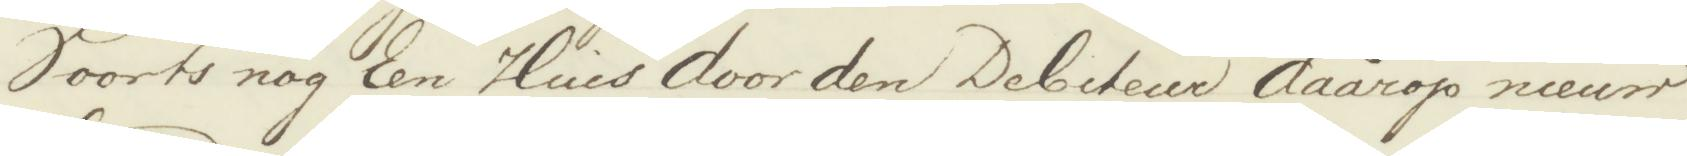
Voorts nog Een Huis door den Debiteur daarop nieuw
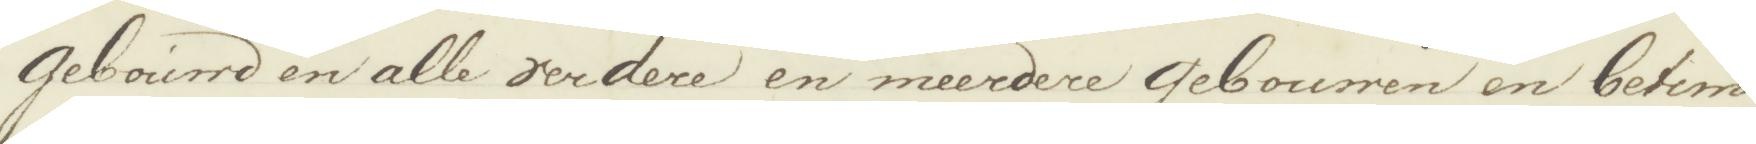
gebouwd en alle verdere en meerdere gebouwen en betim
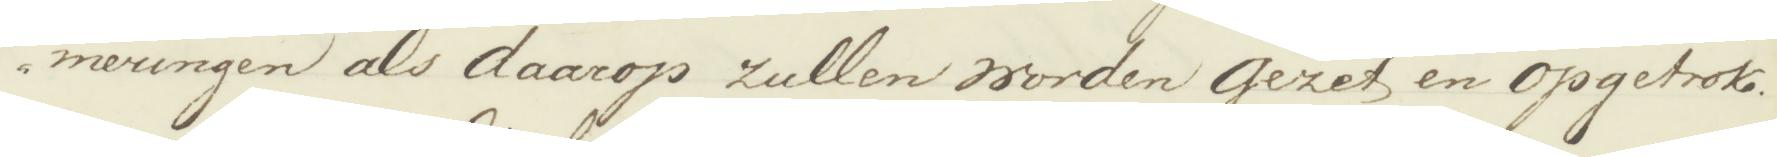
„meringen als daarop zullen worden gezet en opgetrok„
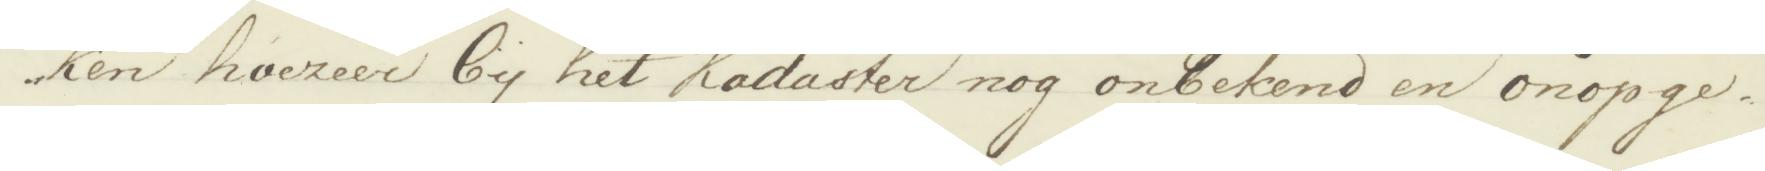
„ken hoezeer bij het Kadaster nog onbekend en onopge„
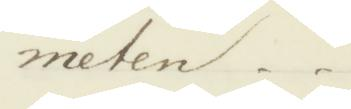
meten - -
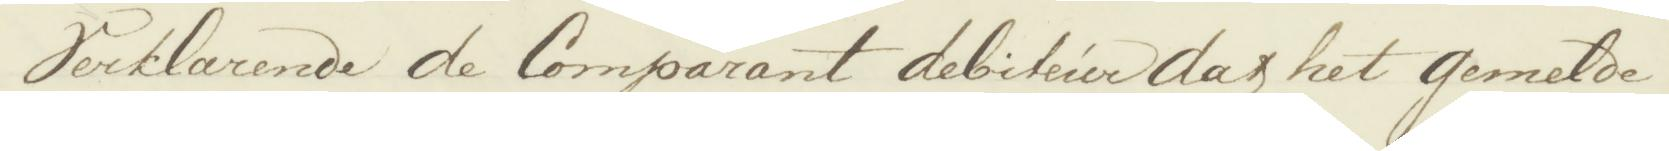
Verklarende de Comparant debiteur dat het gemelde
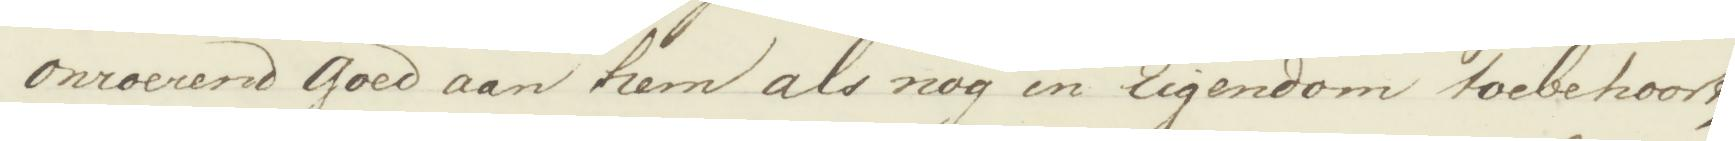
onroerend goed aan hem als nog in Eigendom toebehoort
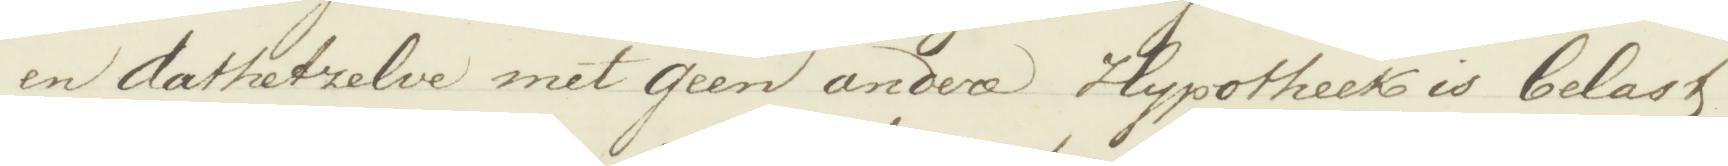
en dathetzelve met geen andere Hypotheek is belast
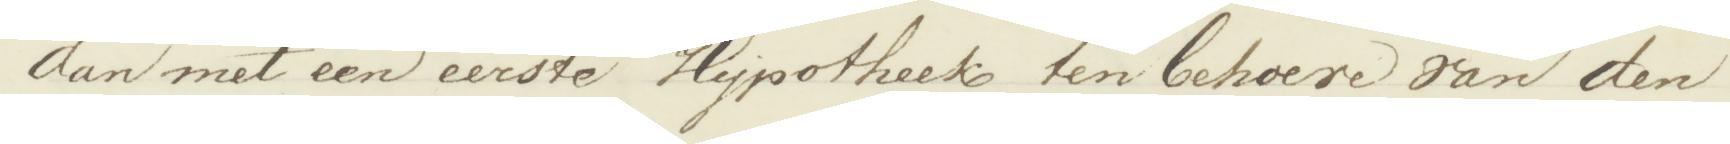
dan met een eerste Hijpotheek ten behoeve van den
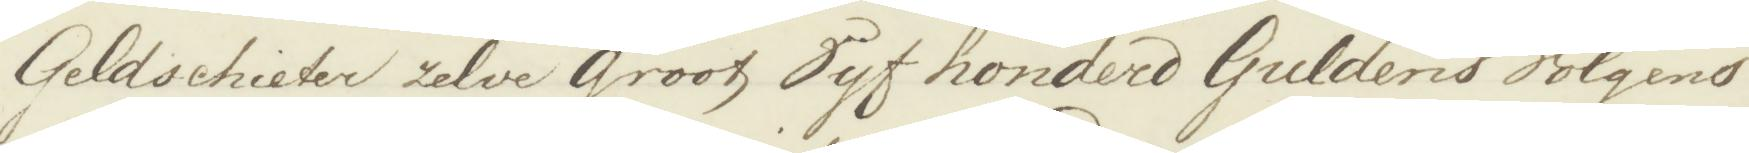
Geldschieter zelve groot Vyf honderd Guldens volgens
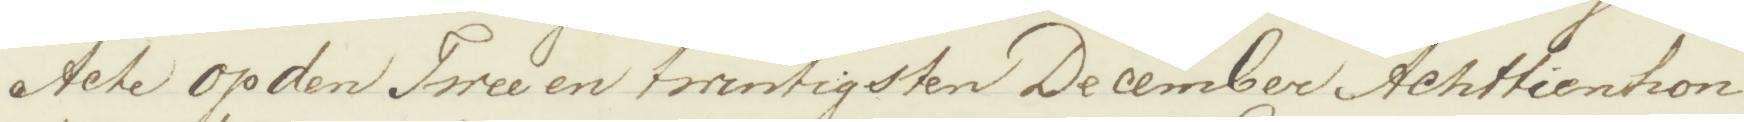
Acte op den Twee en twintigsten December Achttienhon
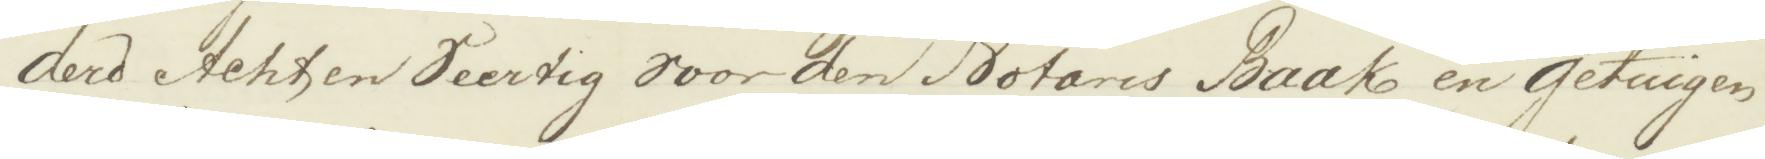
derd Acht en Veertig voor den Notaris Baak en getuigen
